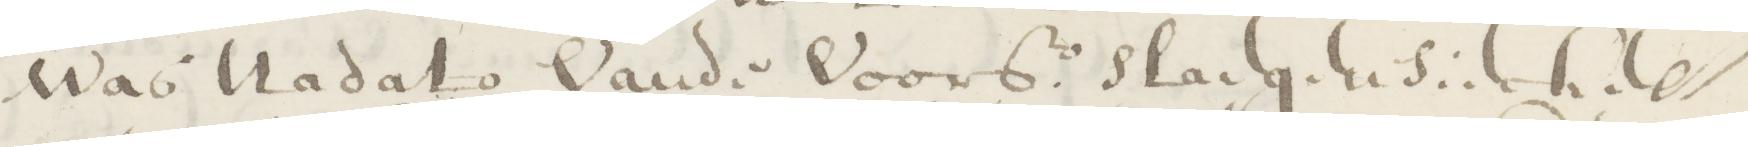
was nadato vande voors.n slaegen sieckelijk
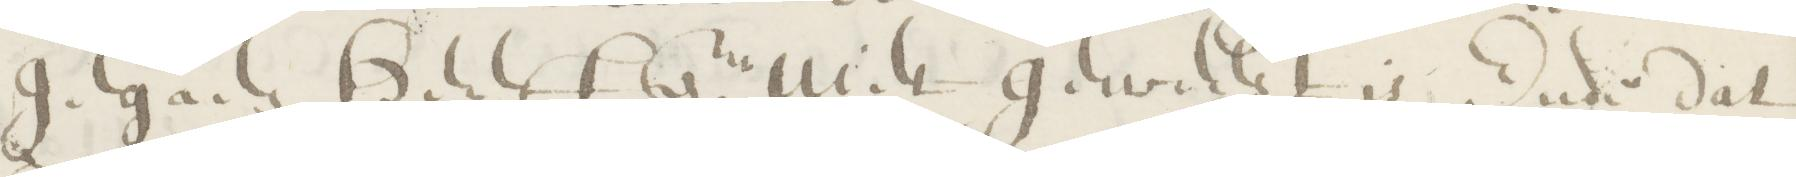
gegaen heeft ende niet geweest is Ende dat
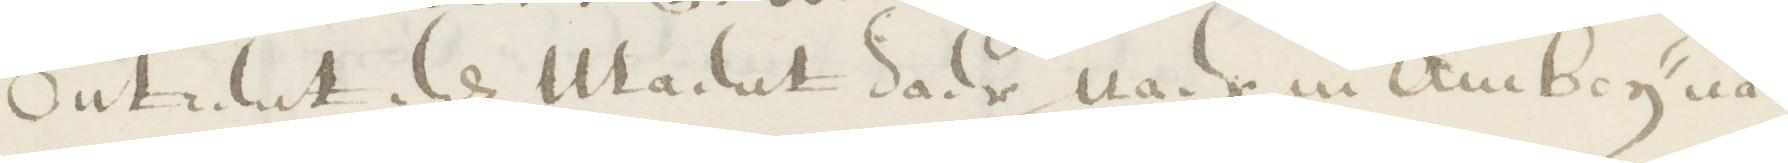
ontrent een maent daer naer in Amboijna
